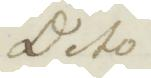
Dito . . . . . . . .
